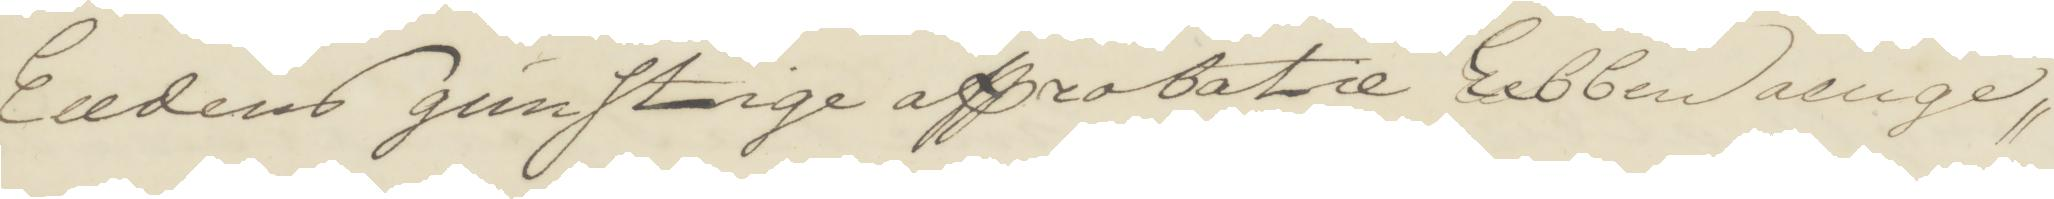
heedens gunstige approbatie hebben aenge„
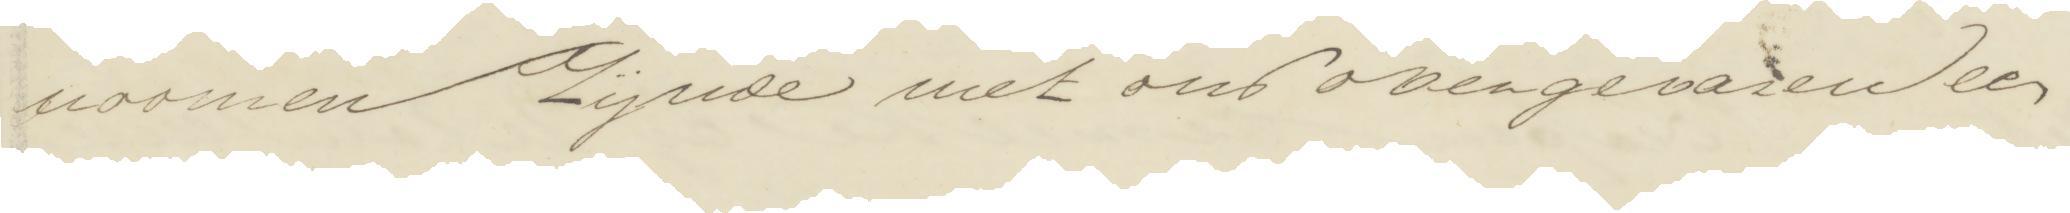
noomen zijnde met ons overgevaren een
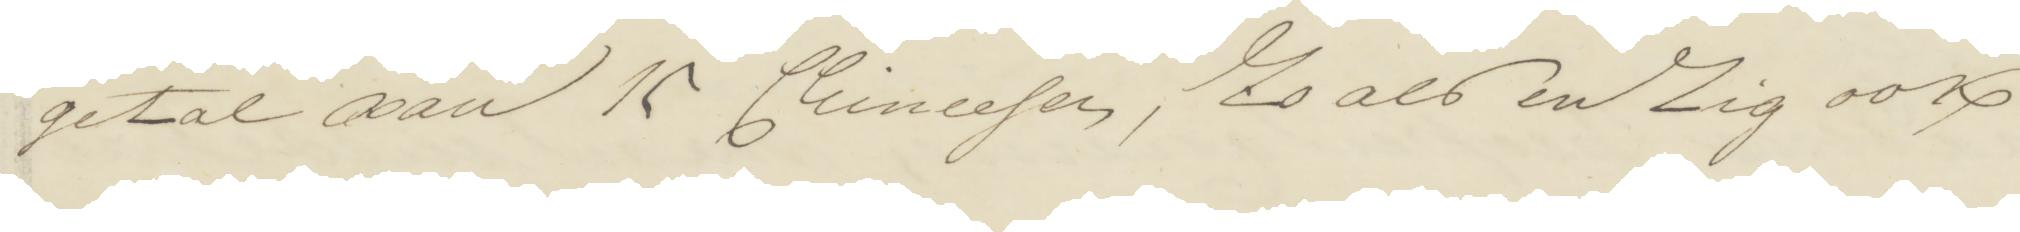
getal van 15 Chineesen, zo als en zig ook
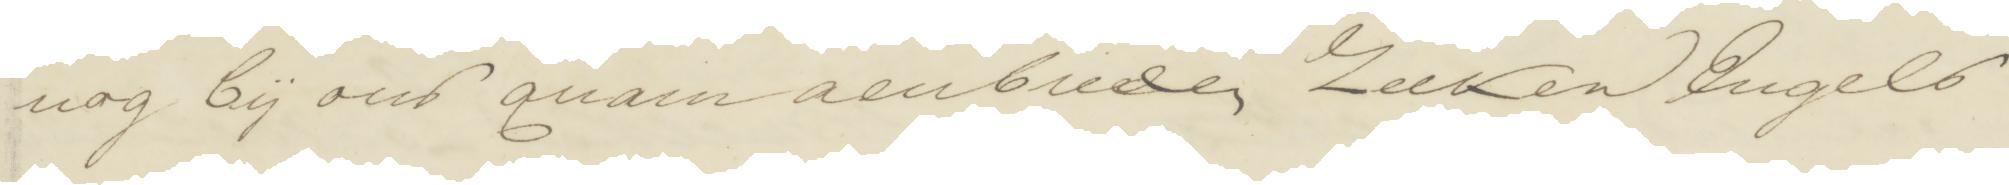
nog bij ons quam aenbieden zeeker Engels
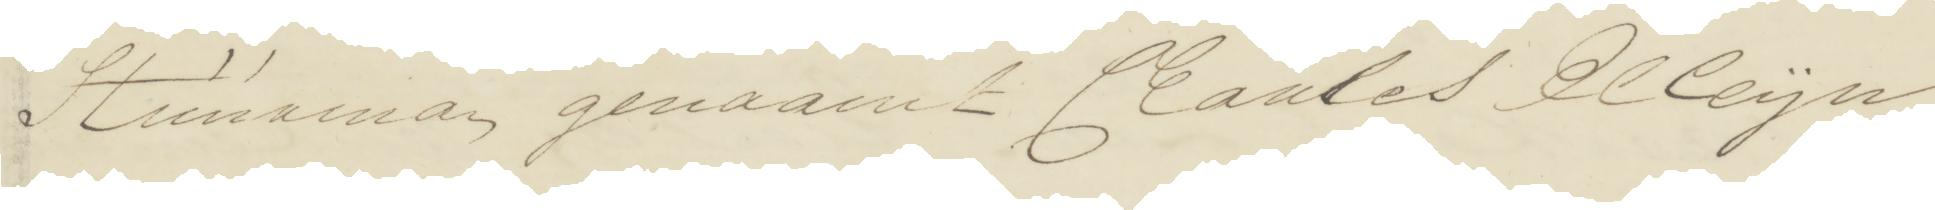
Stuurman genaamt Charles Elleijn
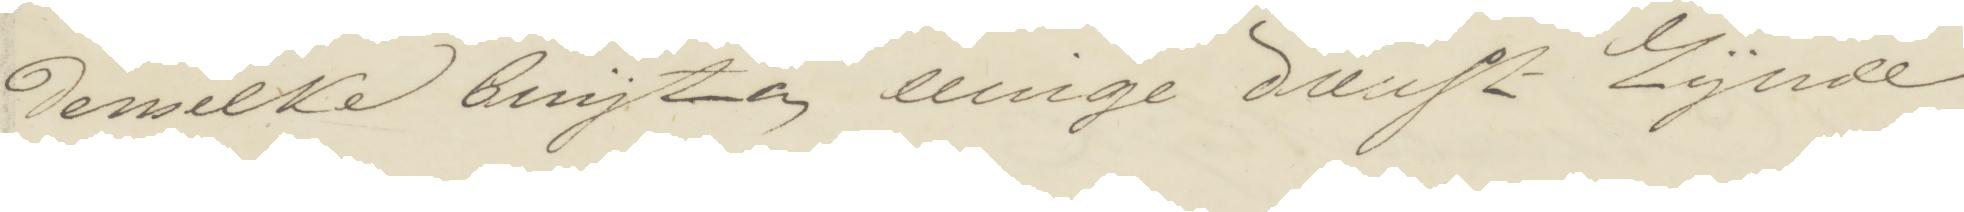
dewelke buijzen eenige dienst zijnde
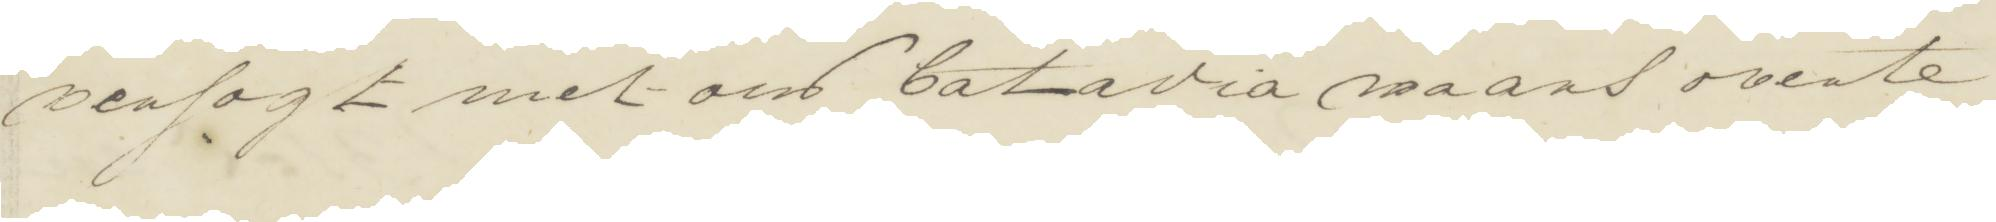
versogt met ons batavia waars over te
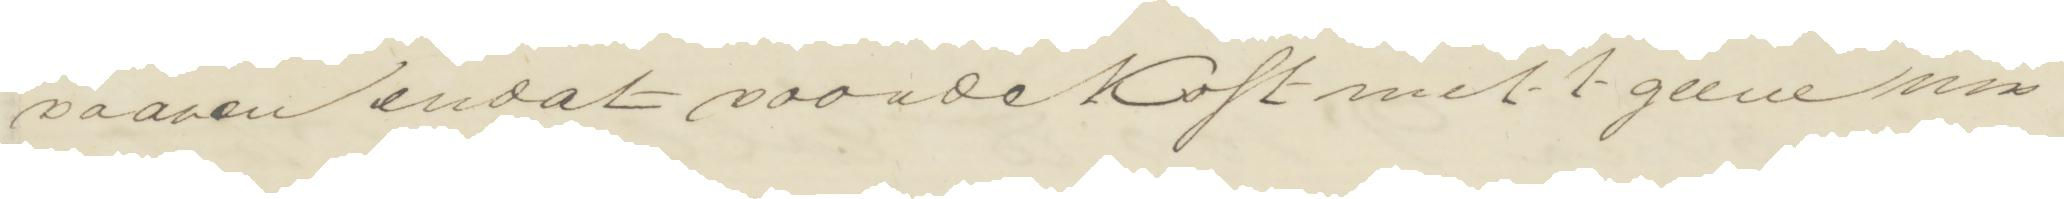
vaaren endat voorde kost met t geene uw
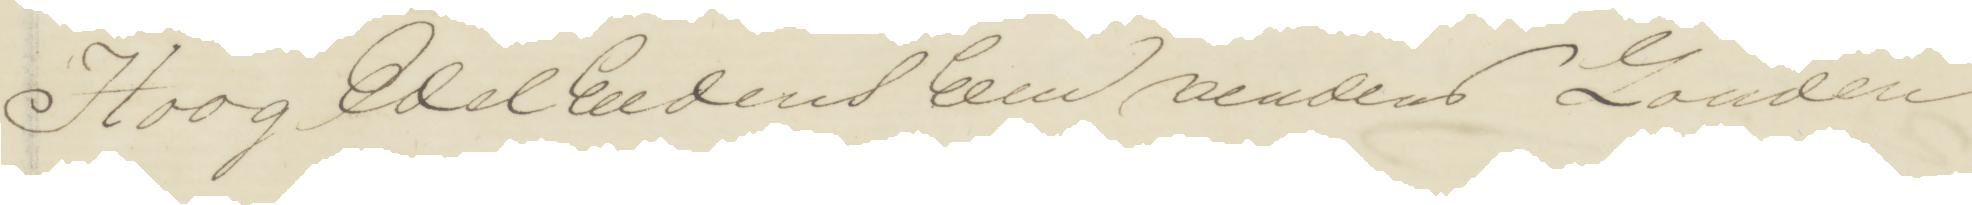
Hoog Edelheedens hem verders zouden
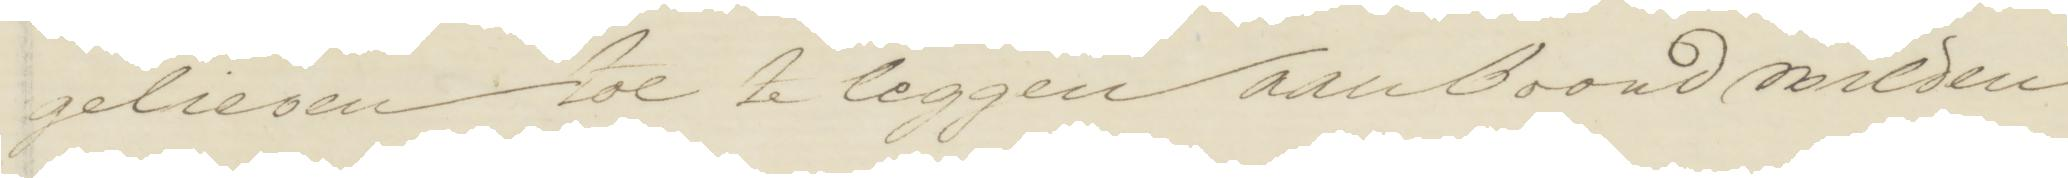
gelieven toe te leggen aan boord wilden
